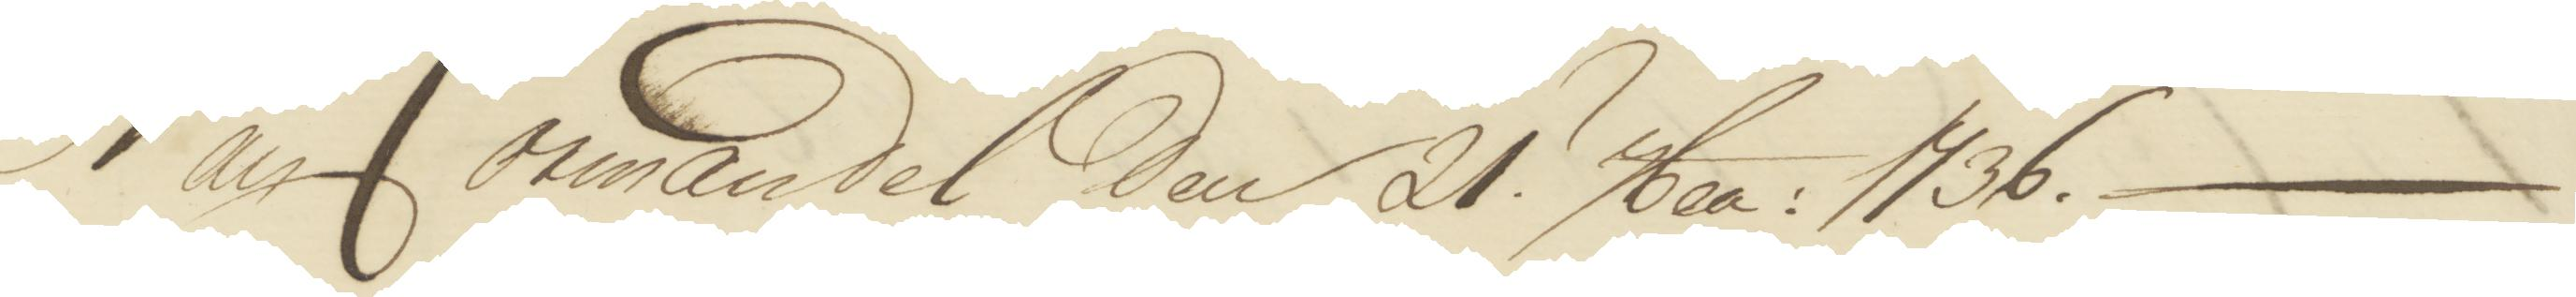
Van Cormandel den 21:' 7ber: 1736. —
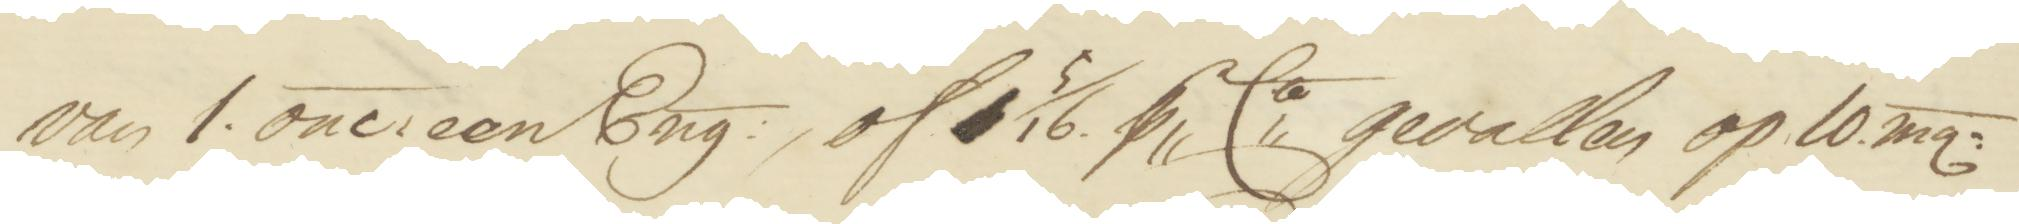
van 1. onc een Eng:, of 1 5/16. p„ C„te gevallen op 10. mq:
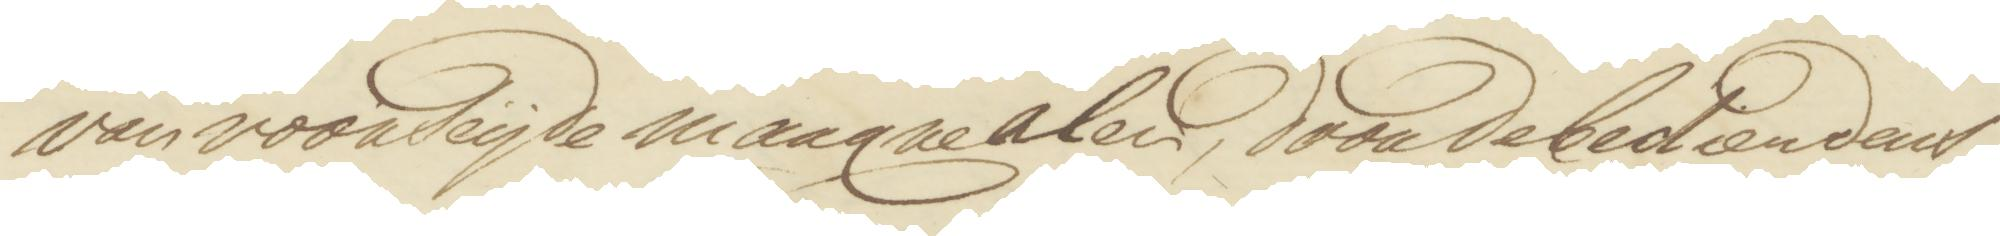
van voorseijde maaqrealen, door de bediendens
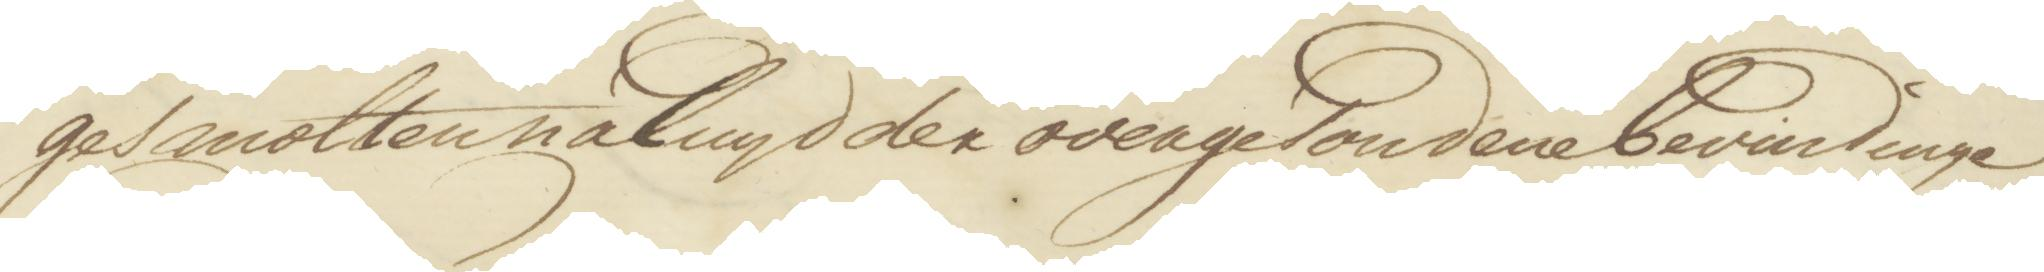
gesmolten naluyd der overgesondene bevindinge
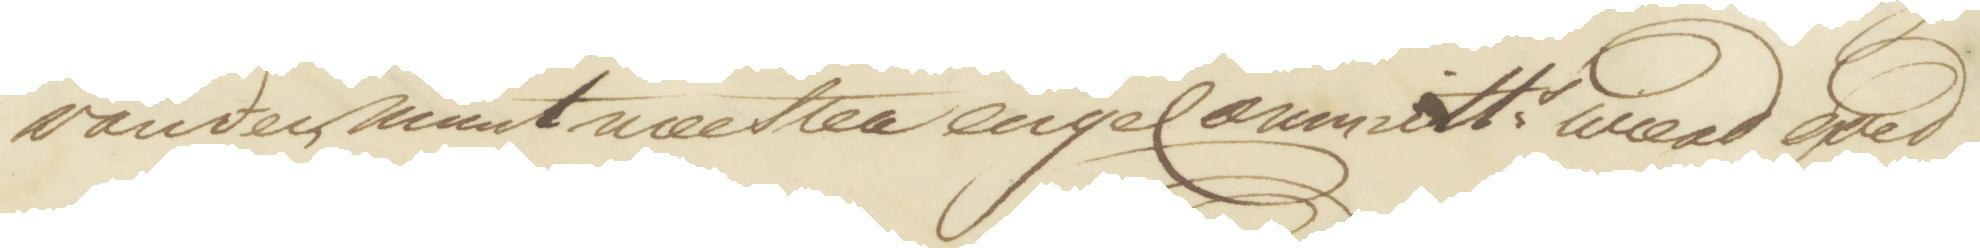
van den muntmeester engecommitt:s wierd goed
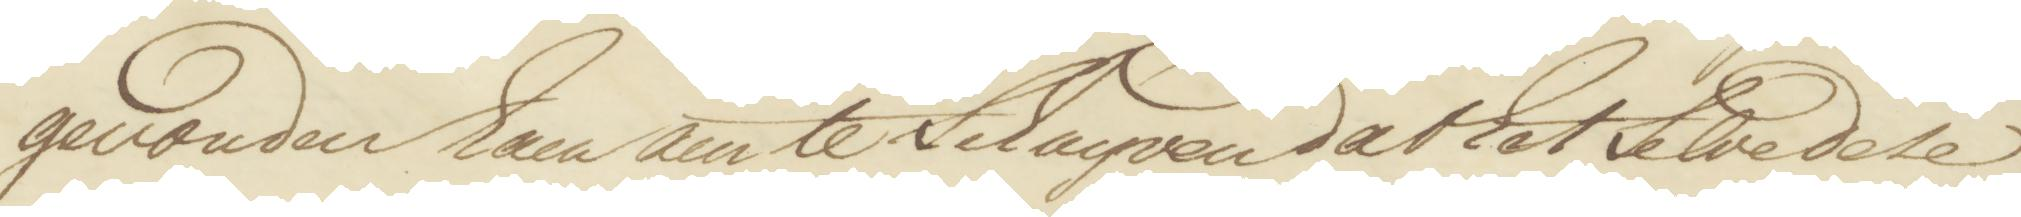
gevonden haer aen te schryven dat het selve dese
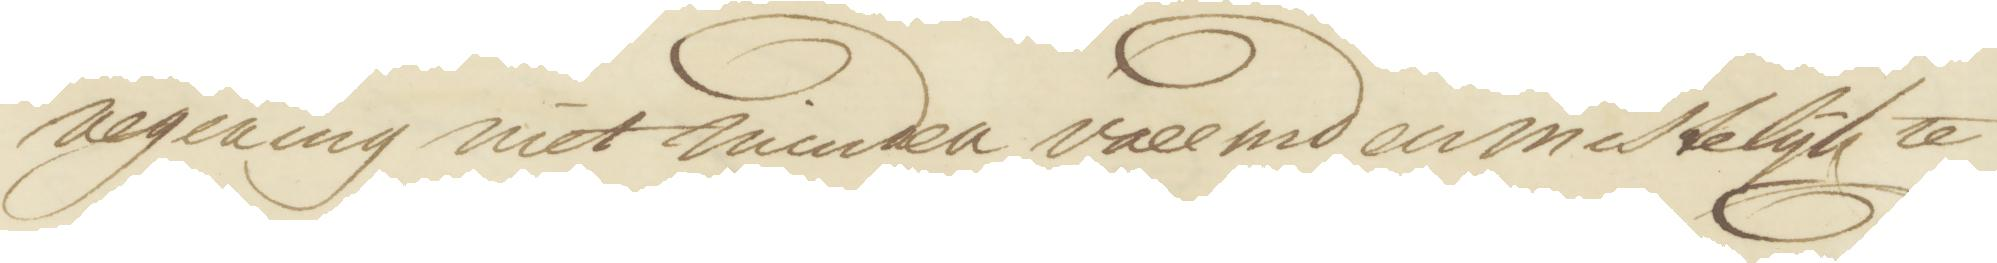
regering niet minder vreemd en mistelijk te
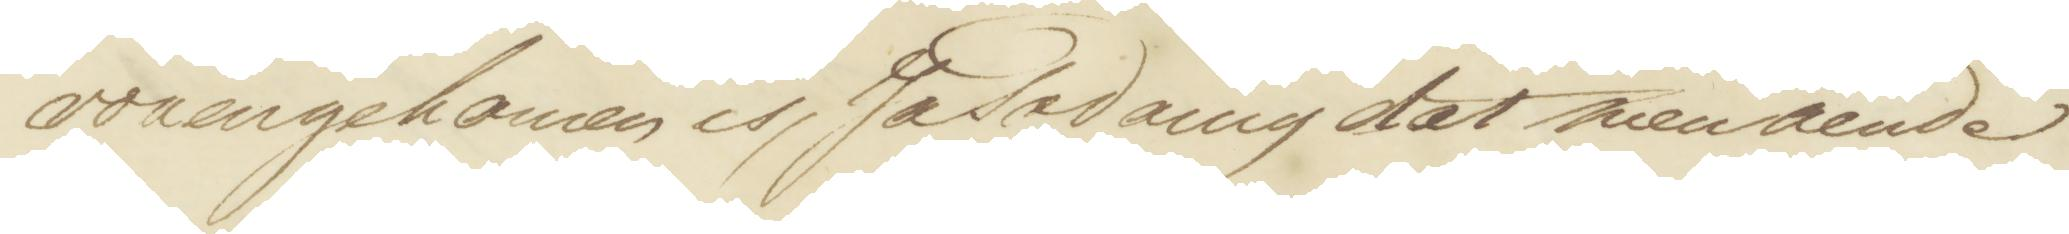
vorengekomen is, Ja sodanig dat hier aende,
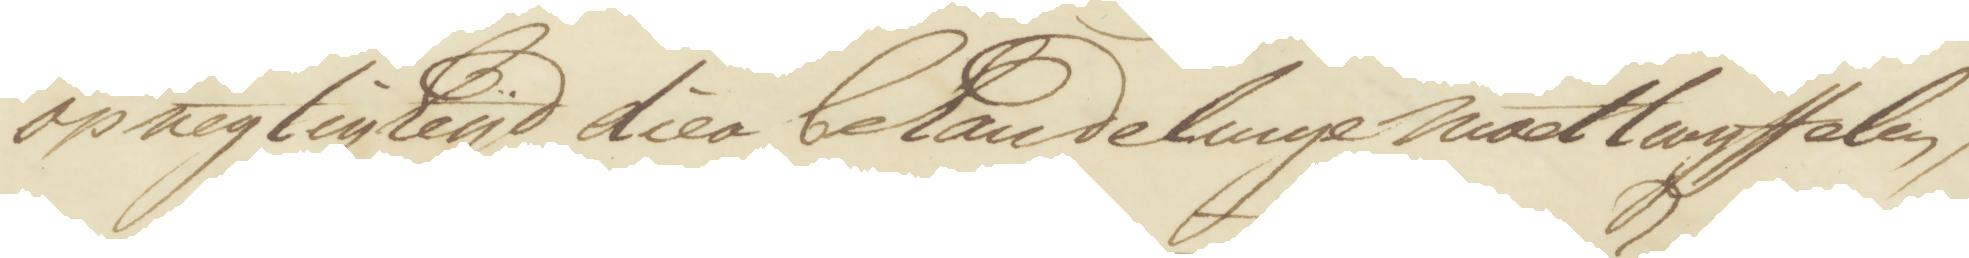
opregtigheijd dier behandelinge moet twyffelen,
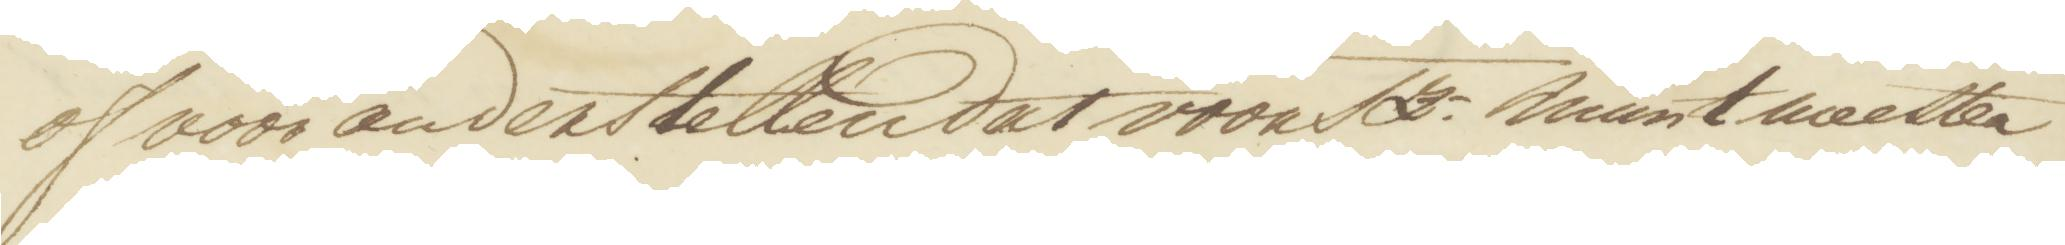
of voor onderstellen dat voorsz: muntmeester
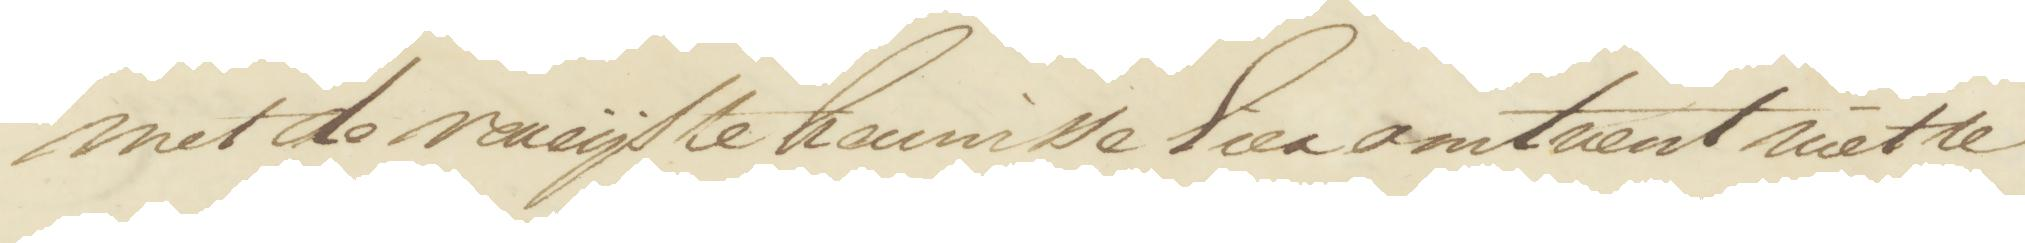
met de vereijste kennisse hier omtrent niet te
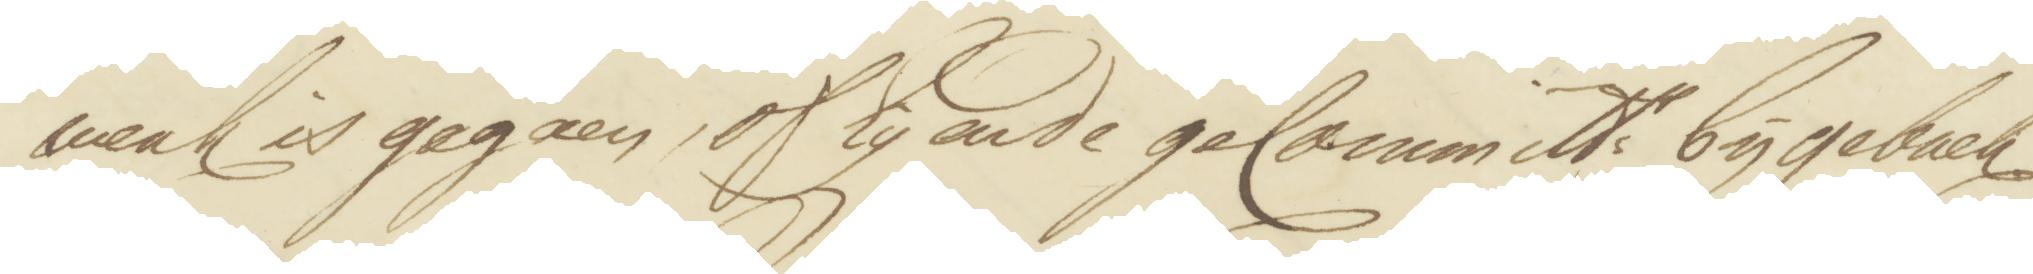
werk is gegaen, of hij ende gecommitt:s bij gebrek
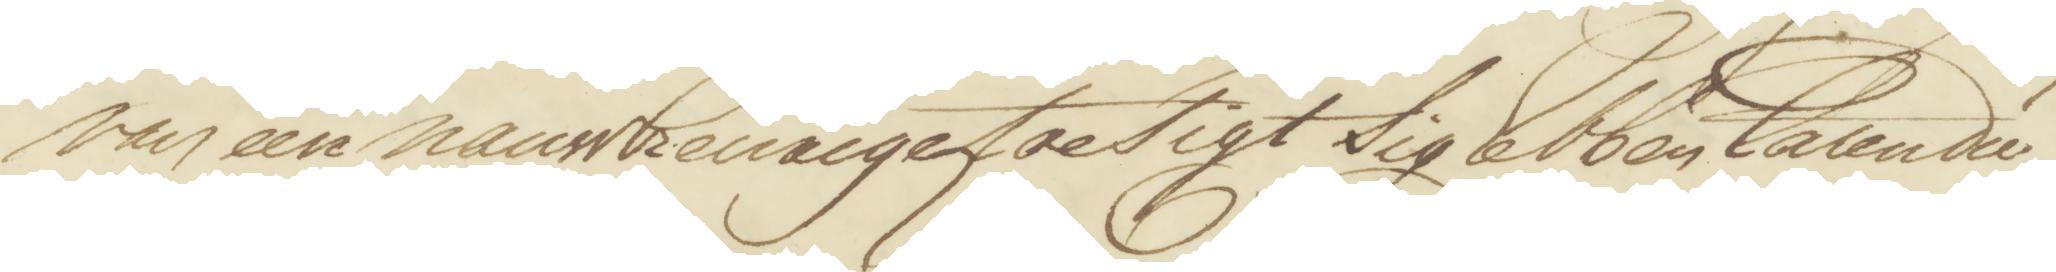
van een nauwkeurigen toesigt sig hebben laten du,
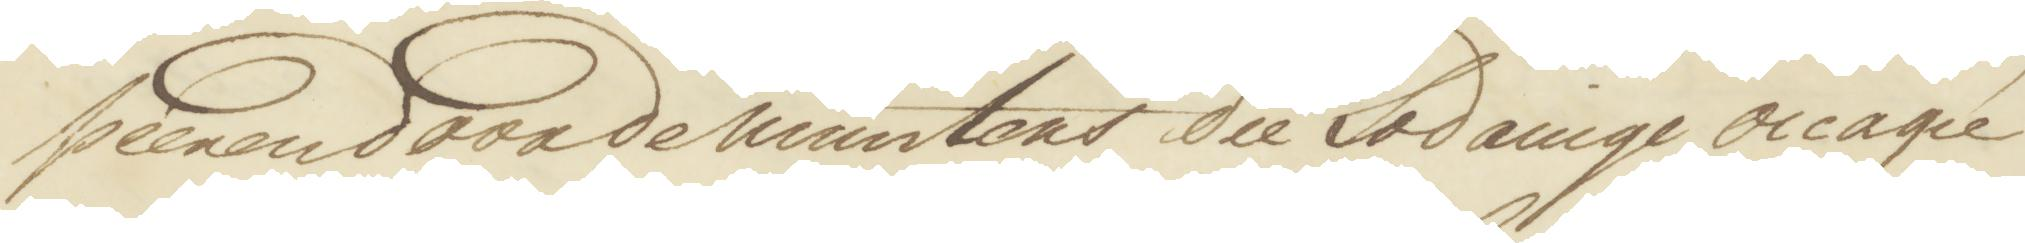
peeren door de munters die sodanige occagie
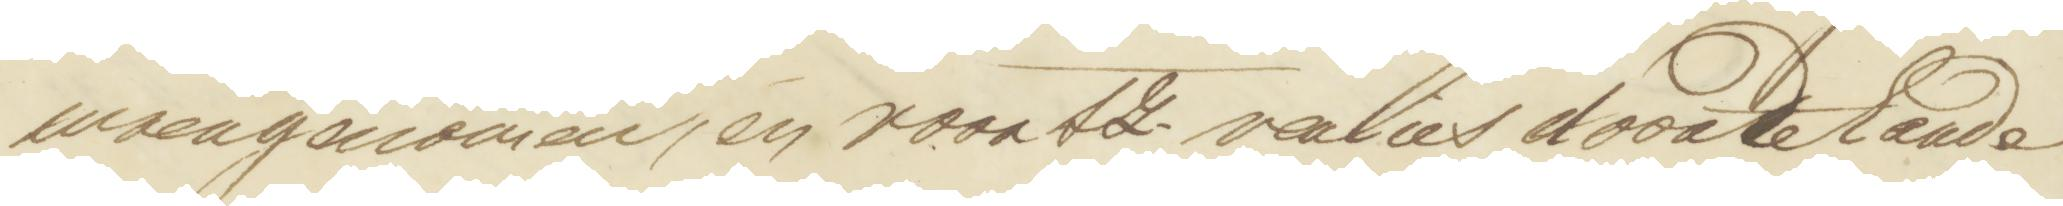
waergenomen, en voorsz: realies door te harde
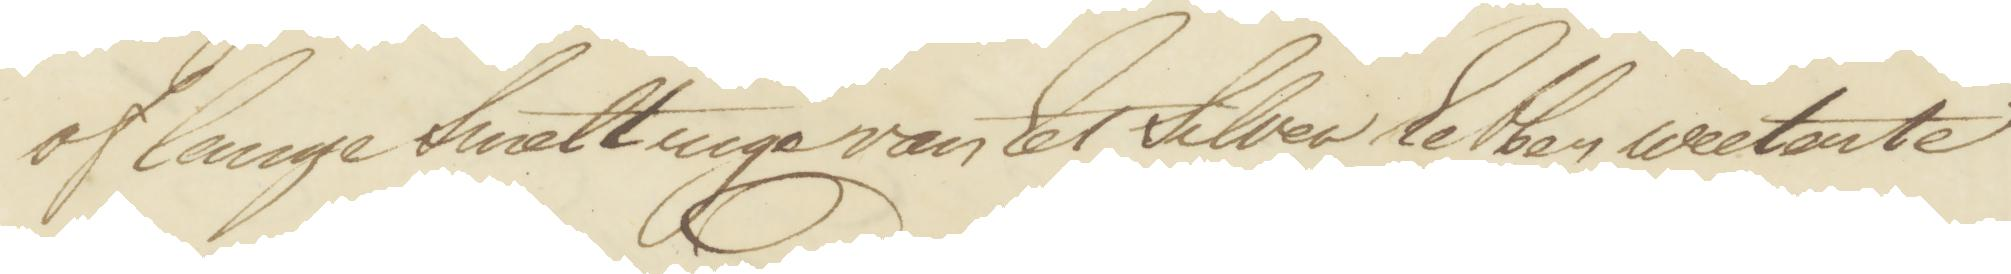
of lange smeltinge van het silver hebben weetente
